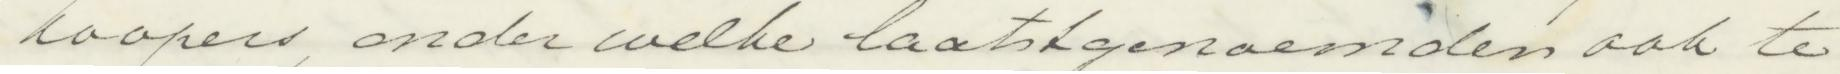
koopers, onder welke laatstgenoemden ook te
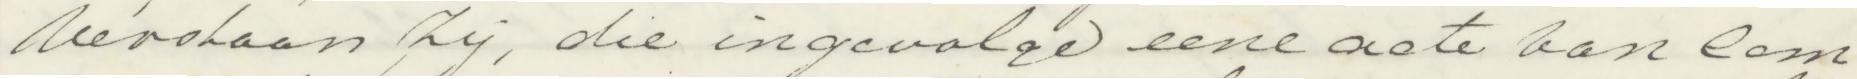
verstaan zij, die ingevolge eene acte van com
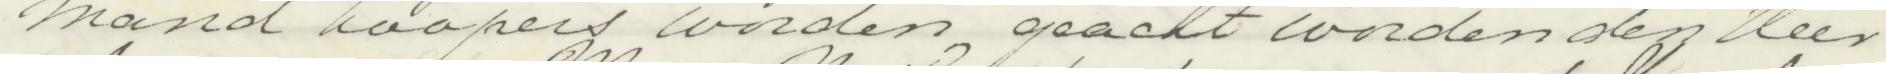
mand koopers worden, geacht worden den Heer
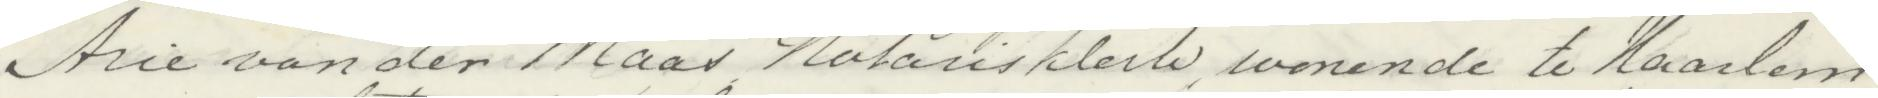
Arie van der Maas, Notarisklerk, wonende te Haarlem
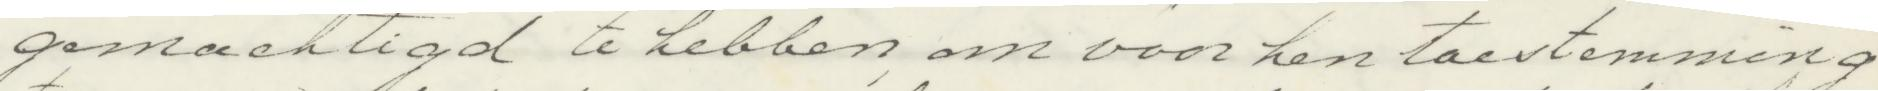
gemachtigd te hebben, om voor hen toestemming
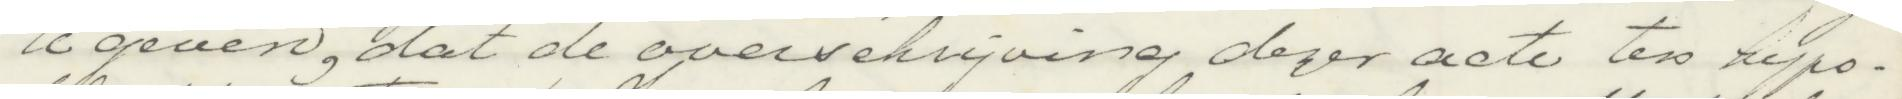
te geven, dat de overschrijving dezer acte ter hypo-
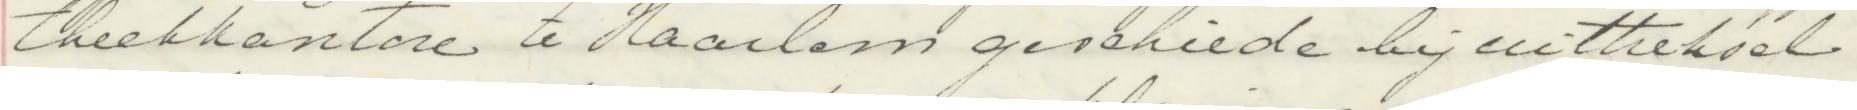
theekkantore te Haarlem geschiede bij uittreksel
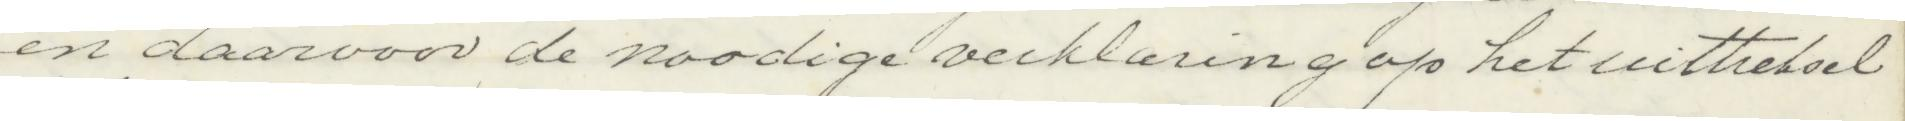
en daarvoor de noodige verklaring op het uittreksel
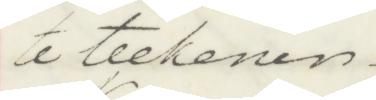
te teekenen.
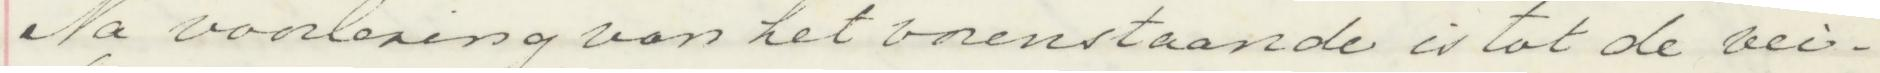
Na voorlezing van het bovenstaande is tot de vei-
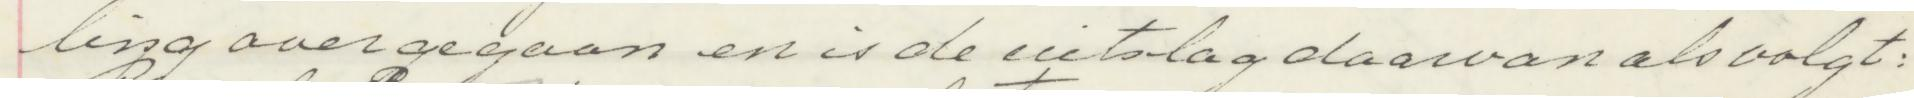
ling overgegaan en is de uitslag daarvan als volgt:
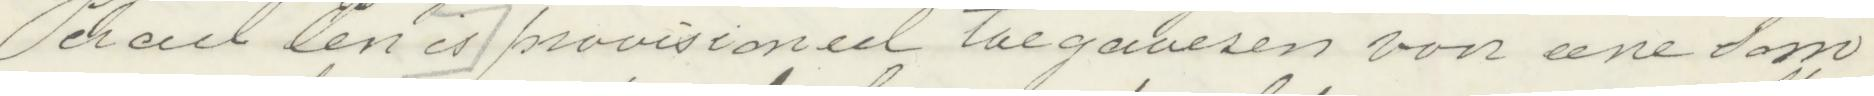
Perceel een is] provisioneel toegewezen voor eene Som
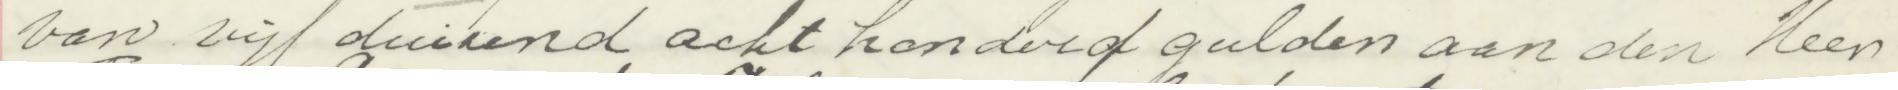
van vijf duizend acht honderd gulden aan den Heer
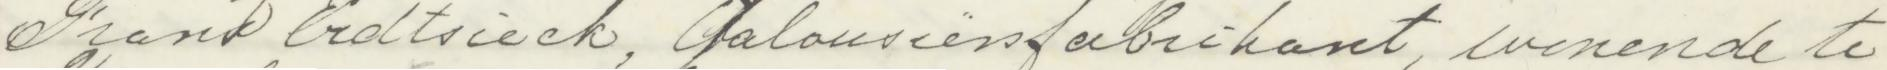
Frans Erdtsieck, Jalousiënfabrikant, wonende te
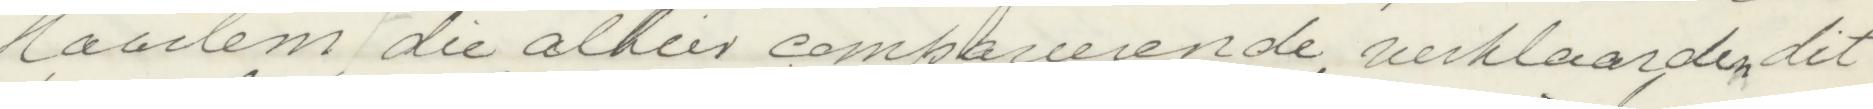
Haarlem, die alhier compareerende, verklaarden dit
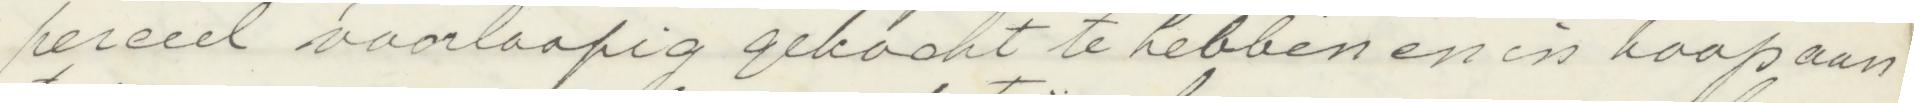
perceel voorloopig gekocht te hebben en in koop aan
